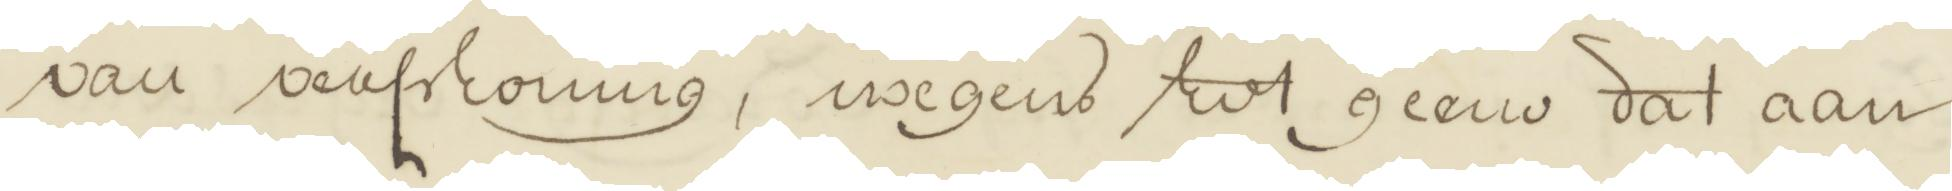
van verschoning, wegens het geene dat aan
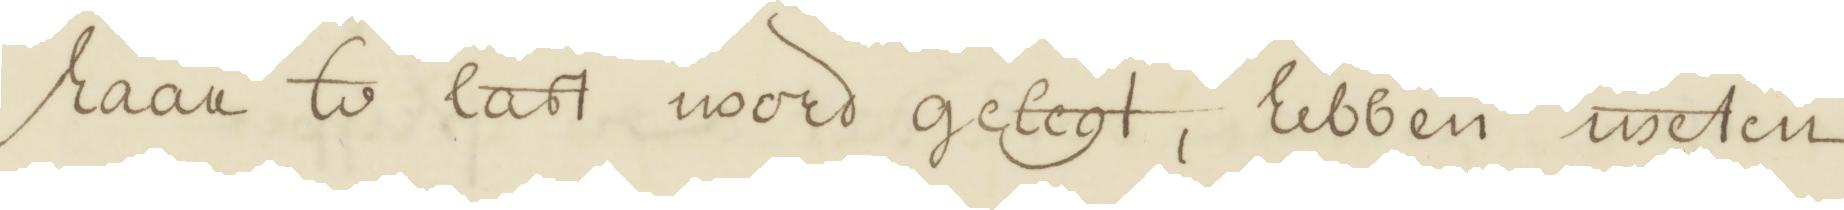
haar te last word gelegt, hebben weten
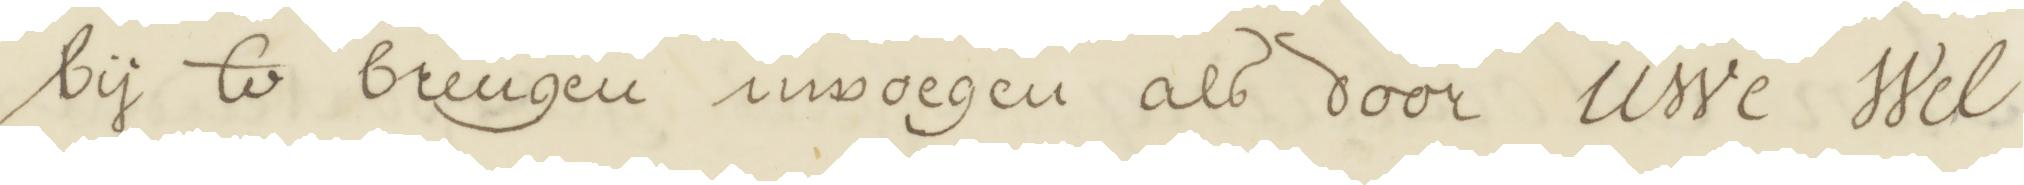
bij te brengen invoegen als door uwe Wel
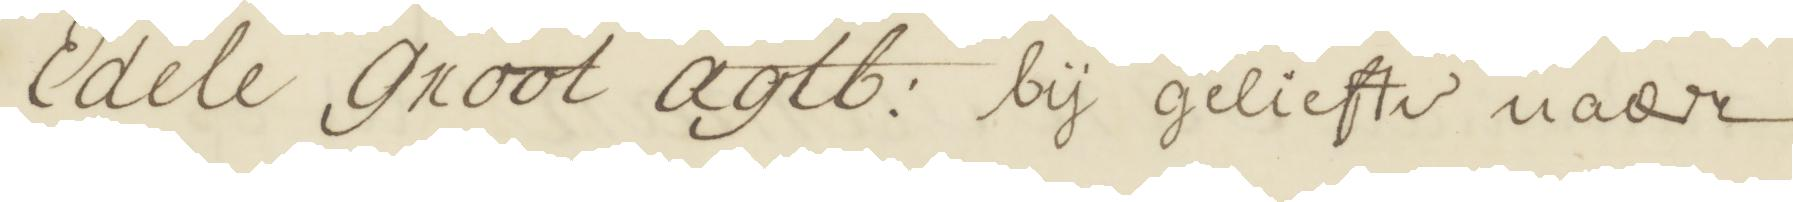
Edele groot agtb: bij geliefte nader
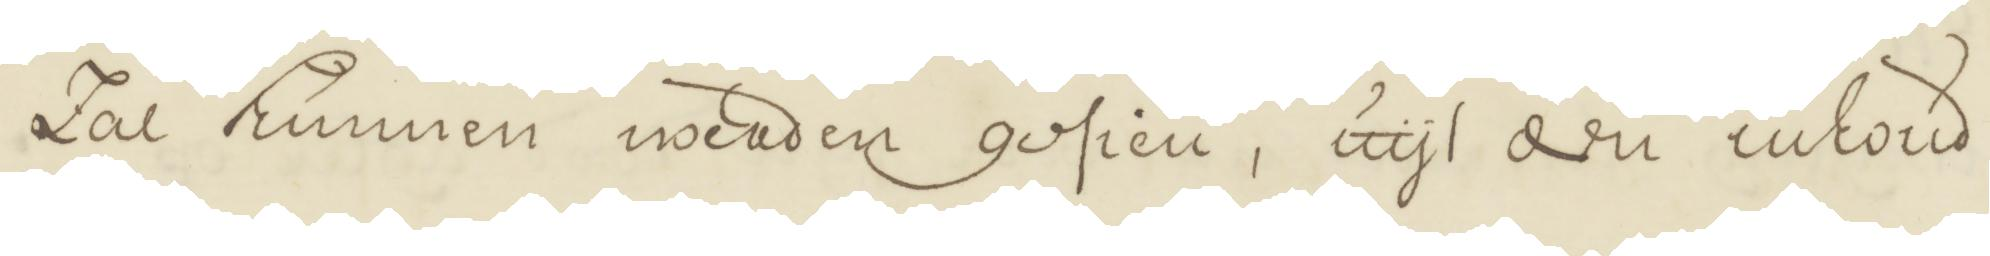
zal kunnen werden gesien, uijt den inhoud
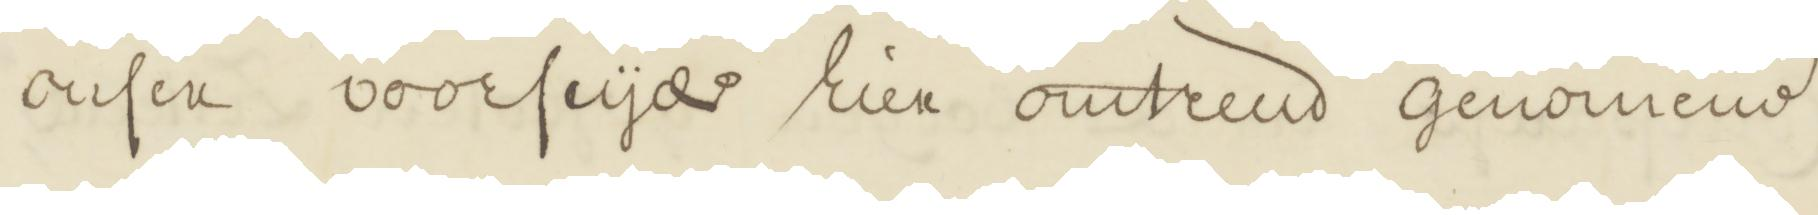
onser voorseijde hier omtrend genomene
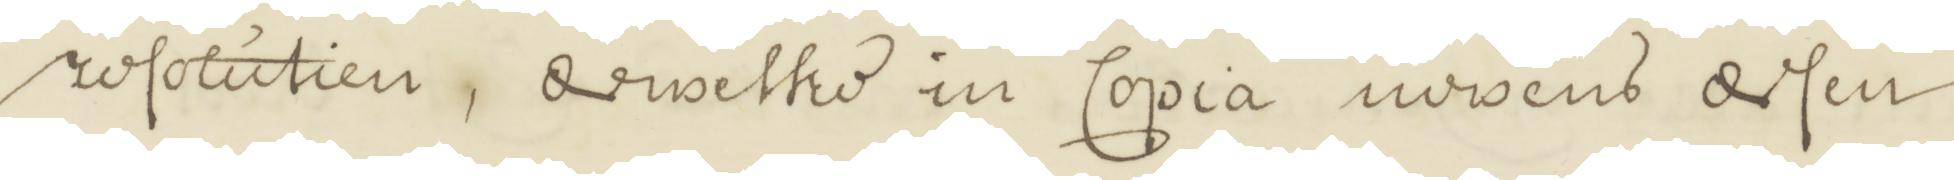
resolutien, dewelke in Copia nevens desen
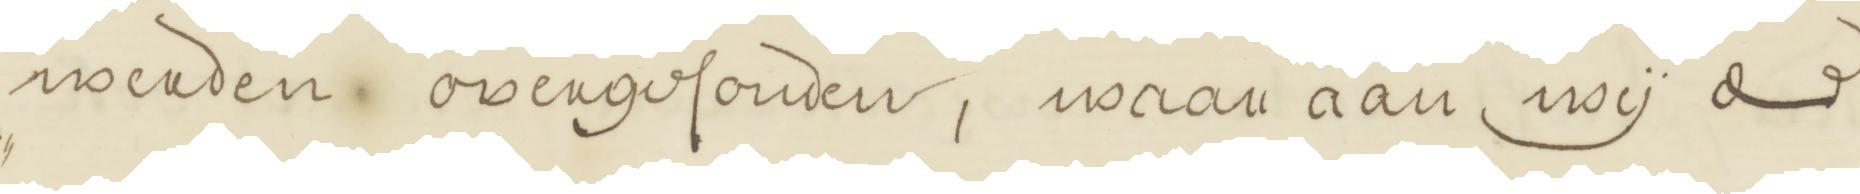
werden overgesonden, waar aan wij de
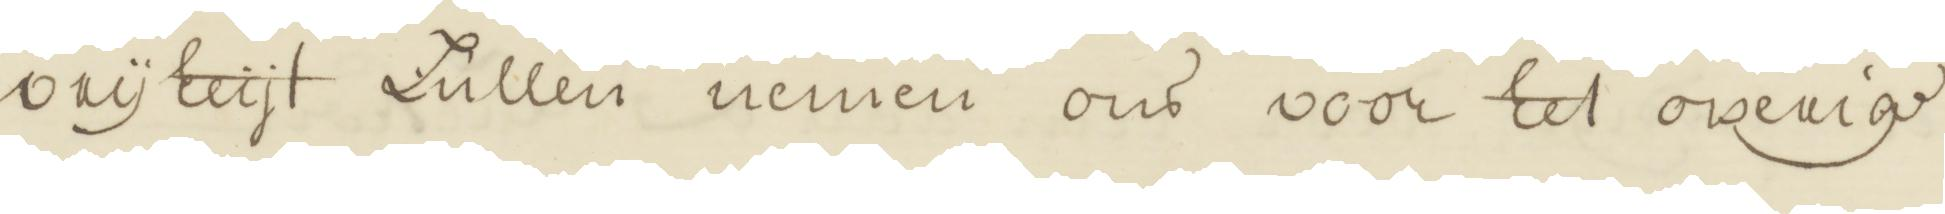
vrijheijt zullen nemen ons voor het overige
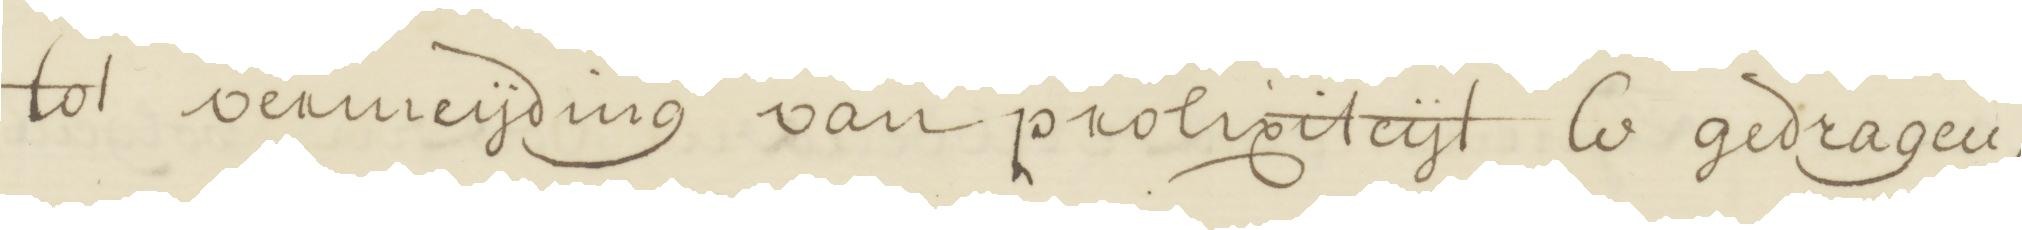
tot vermeijding van prolixiteijt te gedragen,
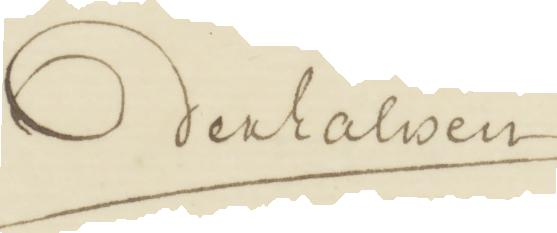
derhalven
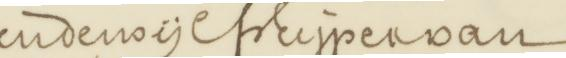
en dewijl schipper van
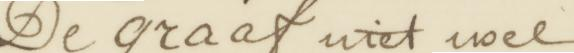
De graaf niet wel
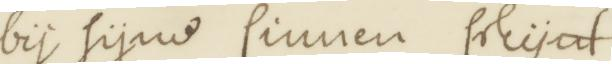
bij sijne sinnen schijnt
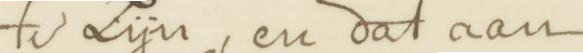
te zijn, en dat aan
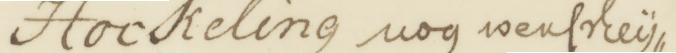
Hockeling nog verscheij„
